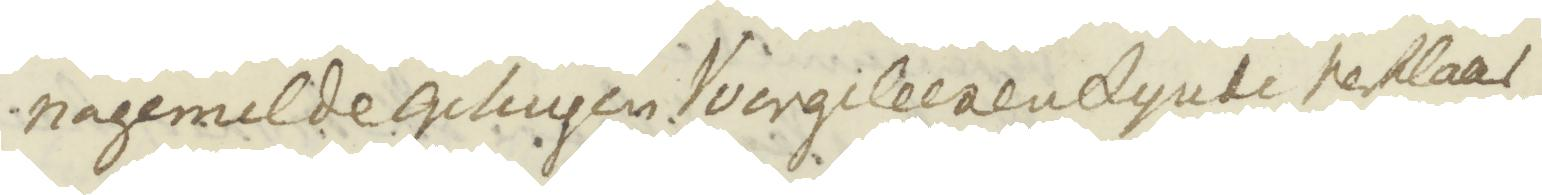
nagemelde getuygen Voorgeleezen zijnde verklaar
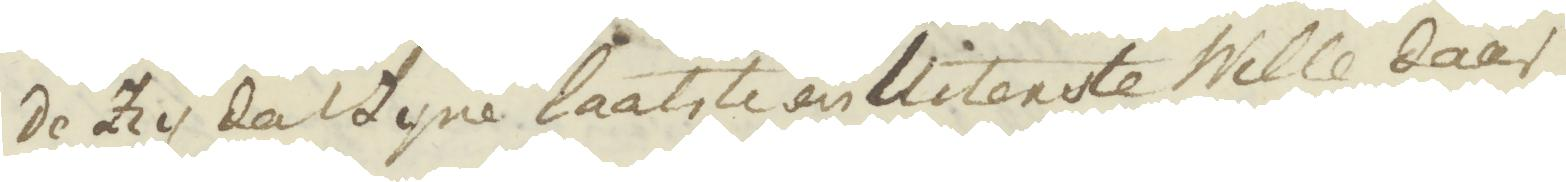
de Zy dat zyne laatste en Uiterste Wille daar
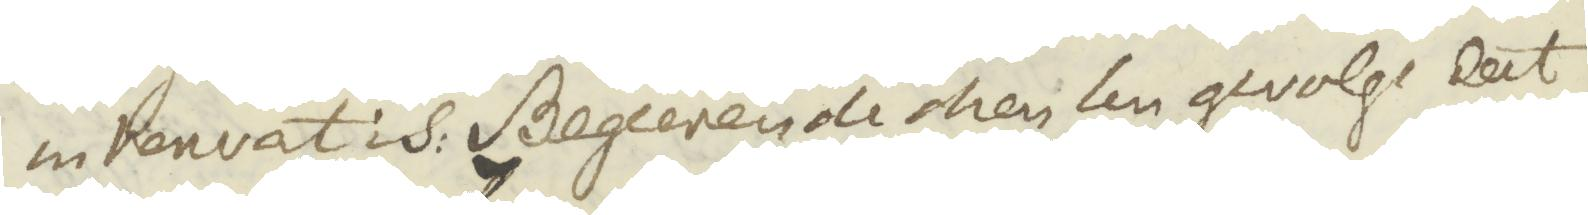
in vervat is: Begeerende dien ten gevolge dat
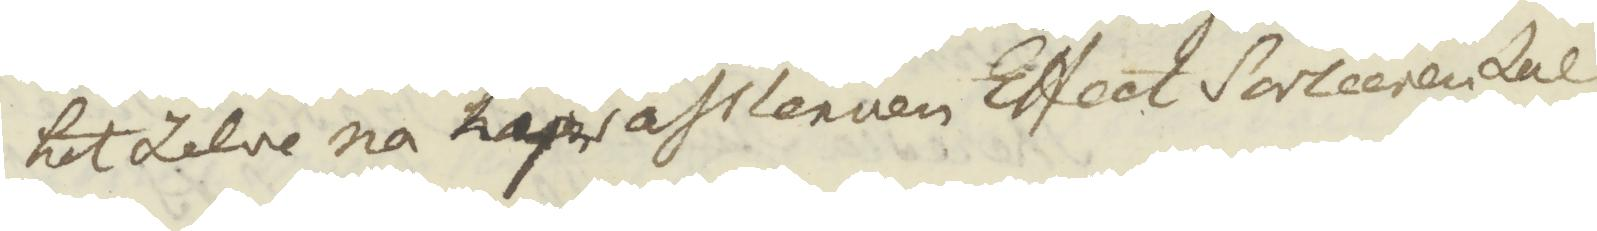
het zelve na Zyn afsterven Effect sorteeren zal
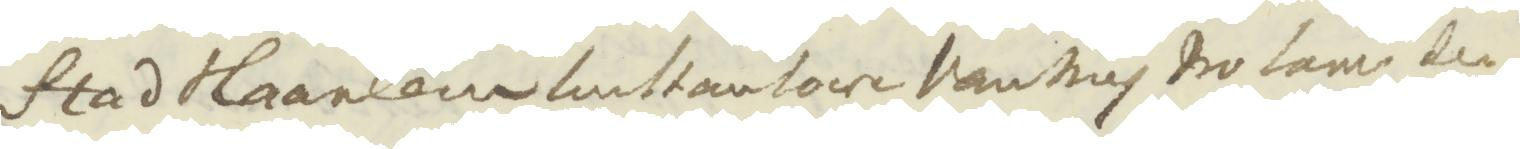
Stad Haarlem ten kantoore van my Notaris den
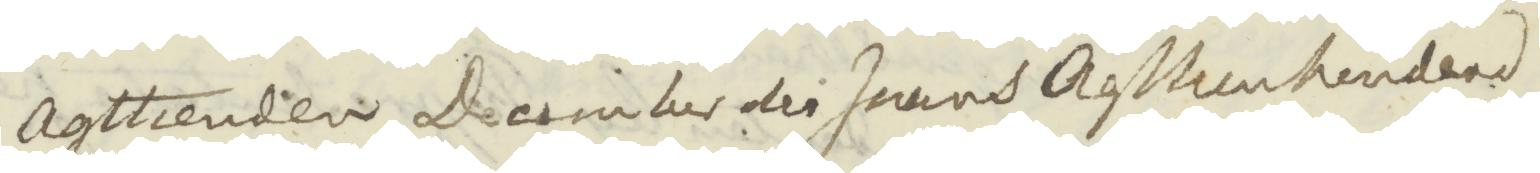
agttienden December des Jaars Agttien honderd
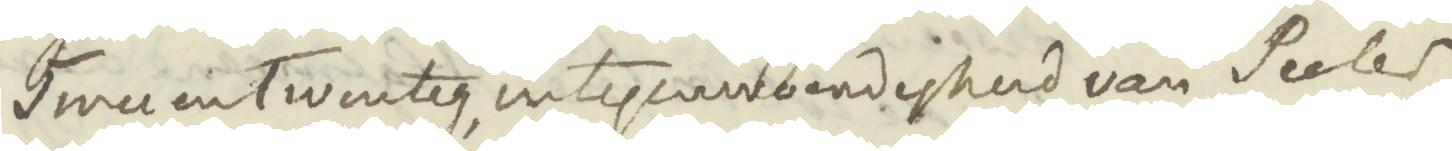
Twee en twintig, integenwoordigheid van Peeter
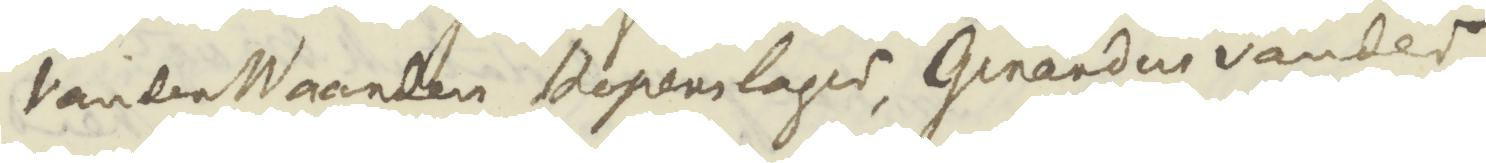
van den Waarden Koperslager, Gerardus vander
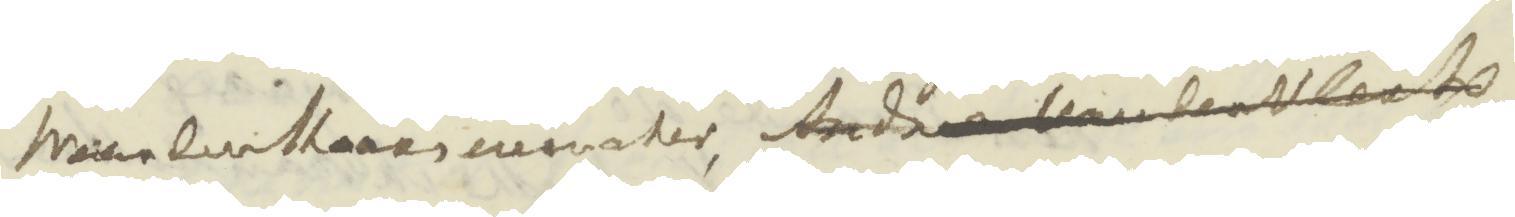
Waarden Kaarsenmaker, Andries van den Vleck
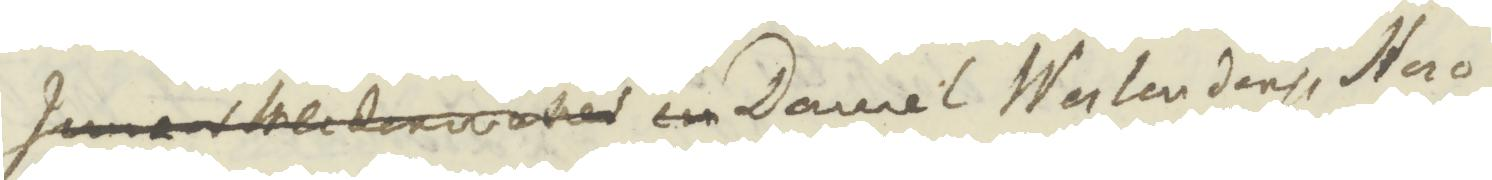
Jumat Wecderwalder en Daniel Westendorp, Horo
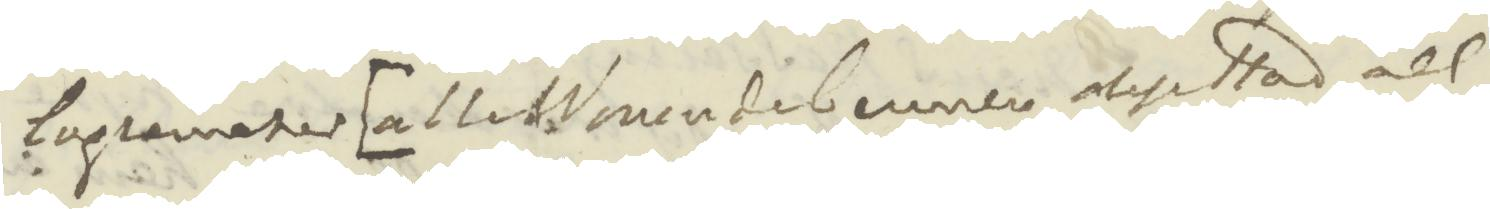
logemaker [alle Wonende binnen dese stad als
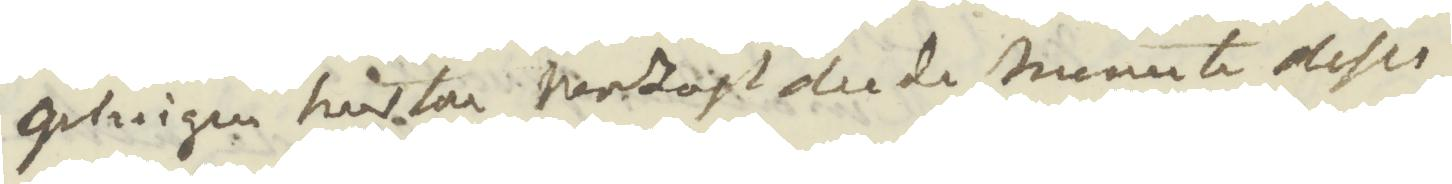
getuigen hiertoe verzogt die de minute deses
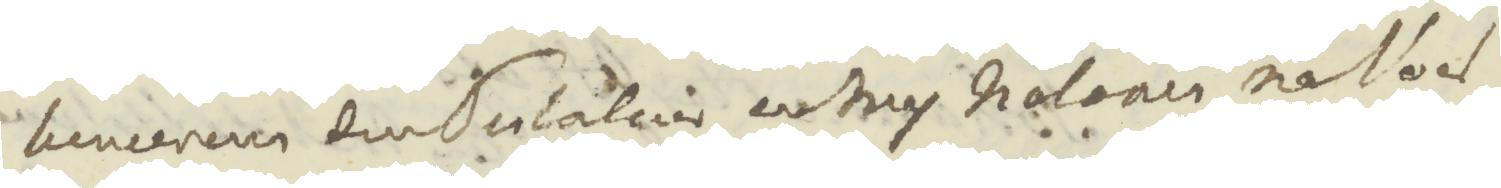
beneevens den Testateur en my Notaris na Voor
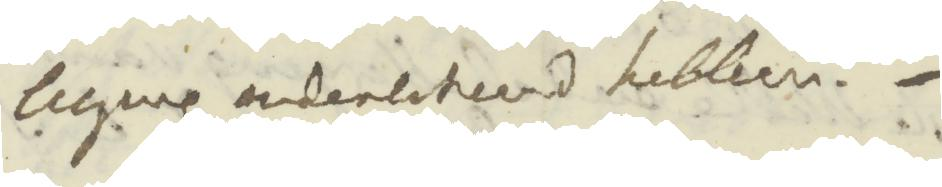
leezing ondertekend hebben. -
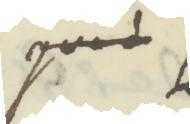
gurd
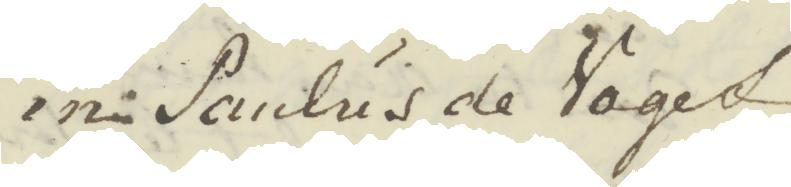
[in: Paulus de Vogel
